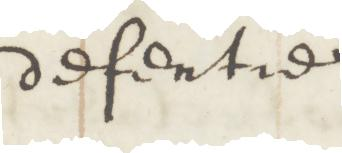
defentie
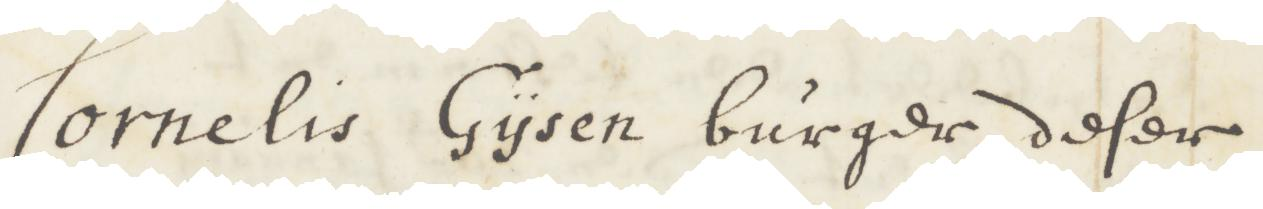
Cornelis Gijsen burger deser
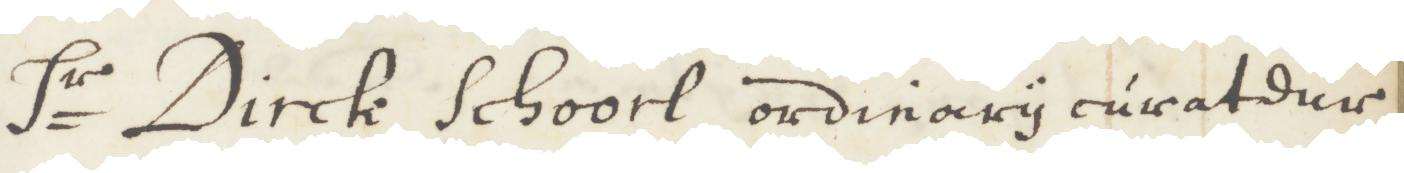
I=r Dirck schoorl ordinarij curateur
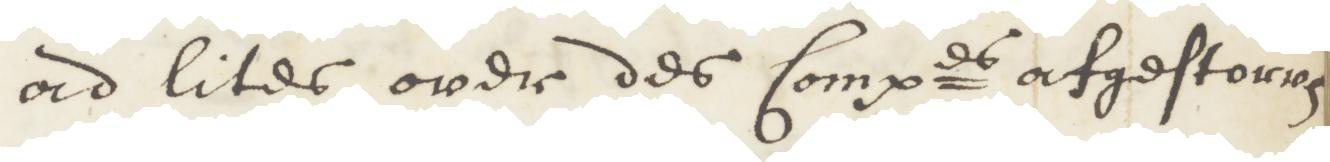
ad lites over des Comp=es afgestorven
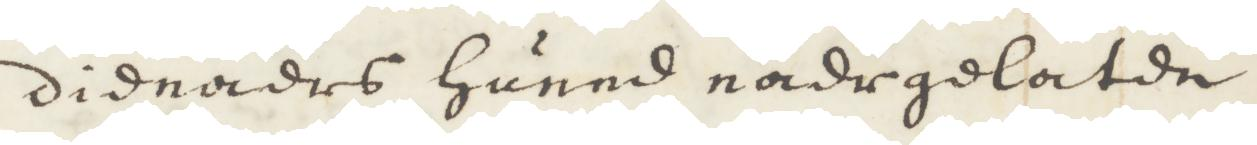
dienaers hunne naer gelaten
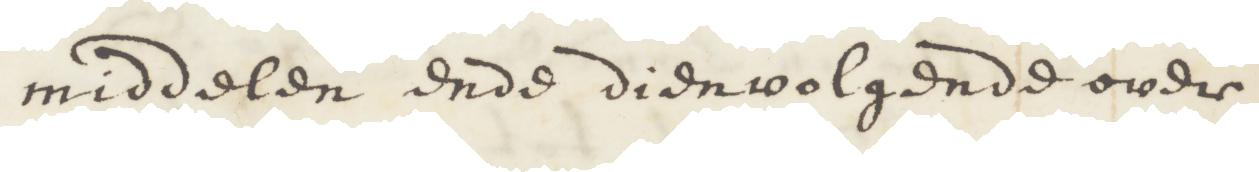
middelen ende dienvolgende over
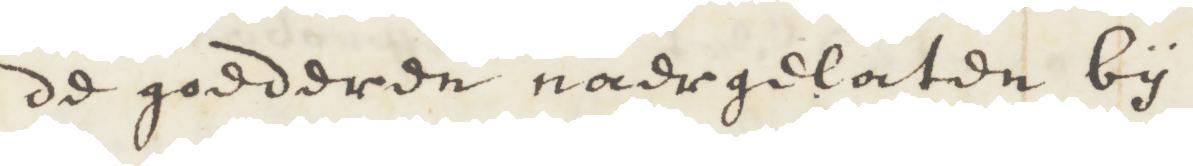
de goederen naer gelaten bij
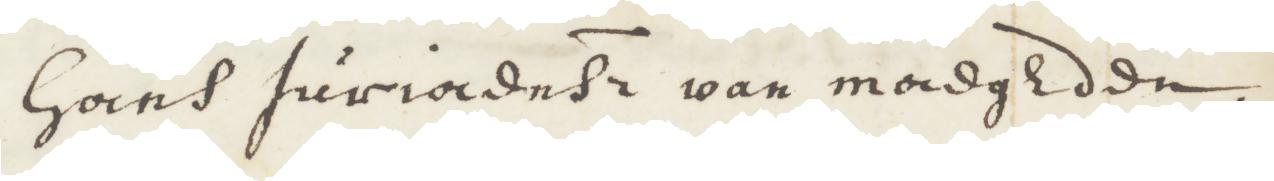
Hans Juriaensz van maeghden„
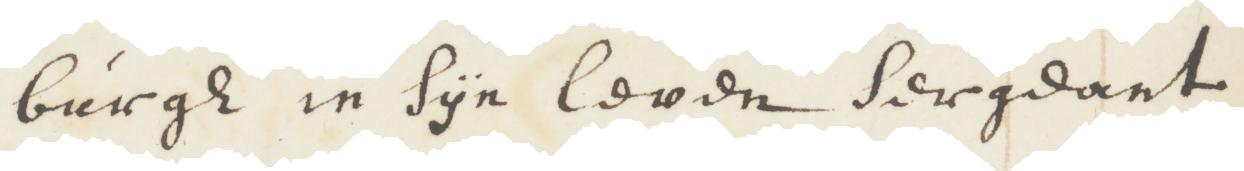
burgh in sijn leven sergeant
